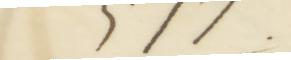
577.
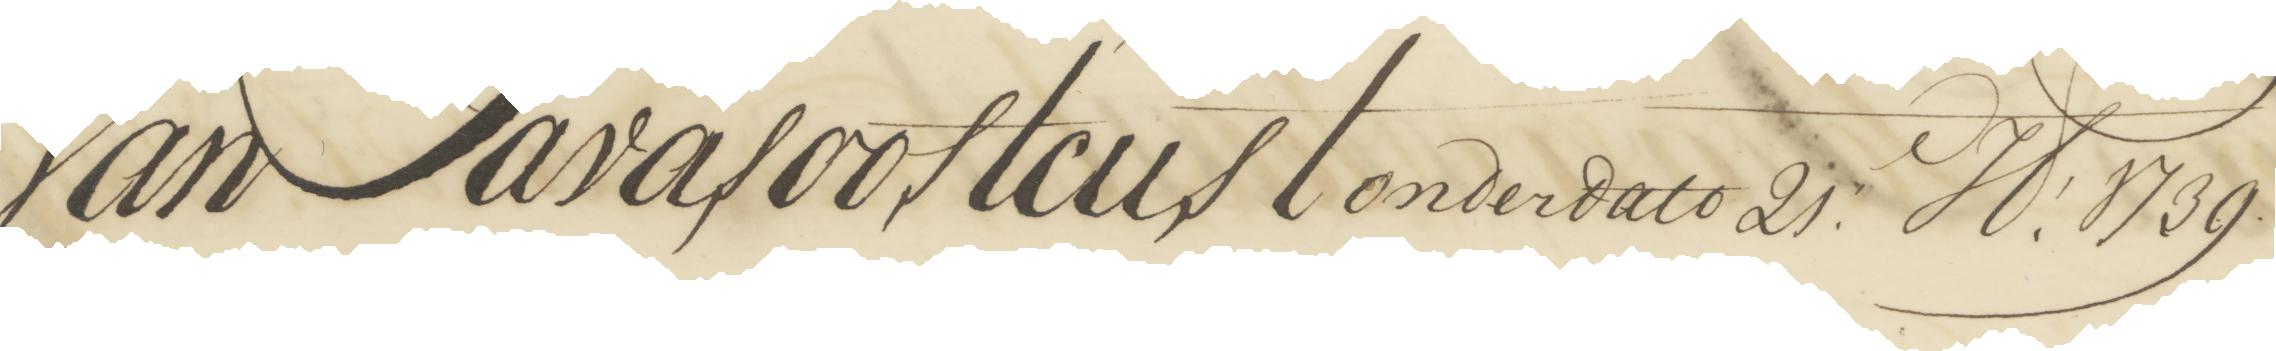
Van Java's oostcust onder dato 21:' 7b: 1739
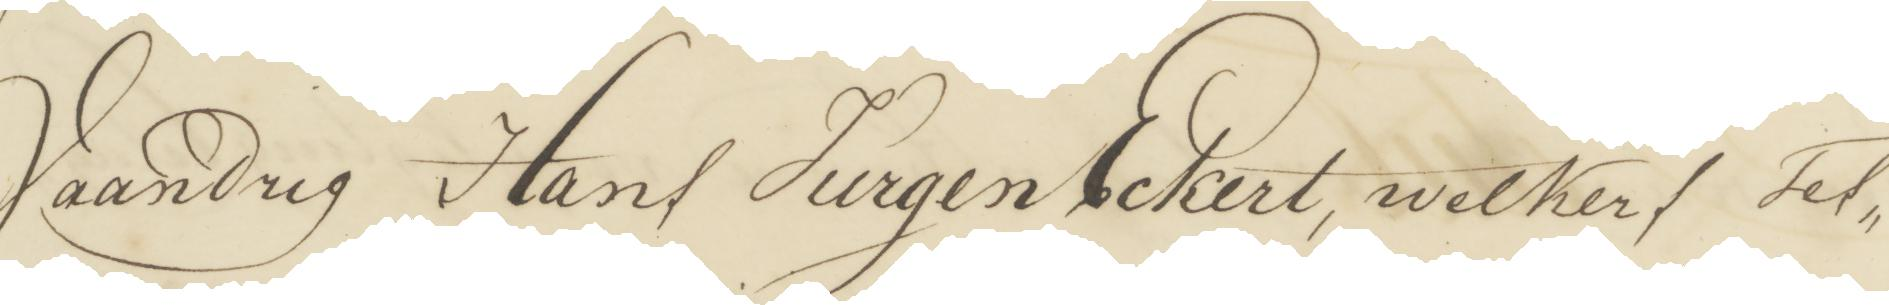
Vaandrig Hans Jurgen Eckert, welkers Tes„
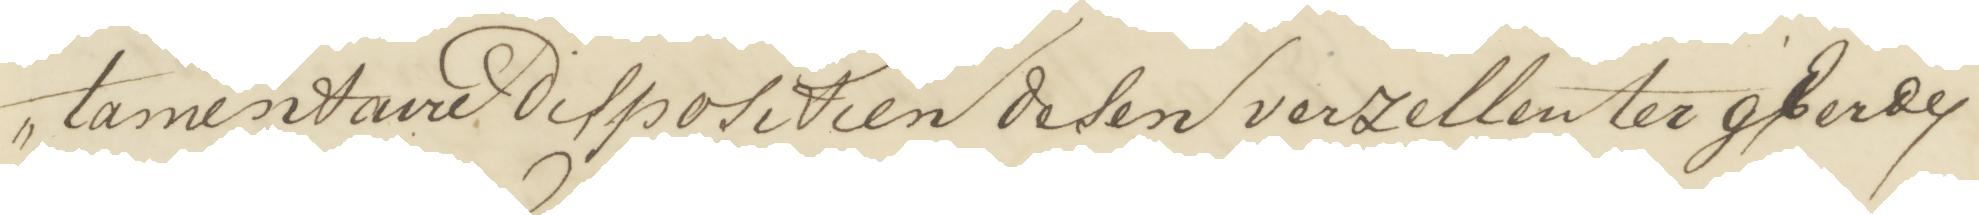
„tamentaire dispositien desen verzellen ter g'Eerde
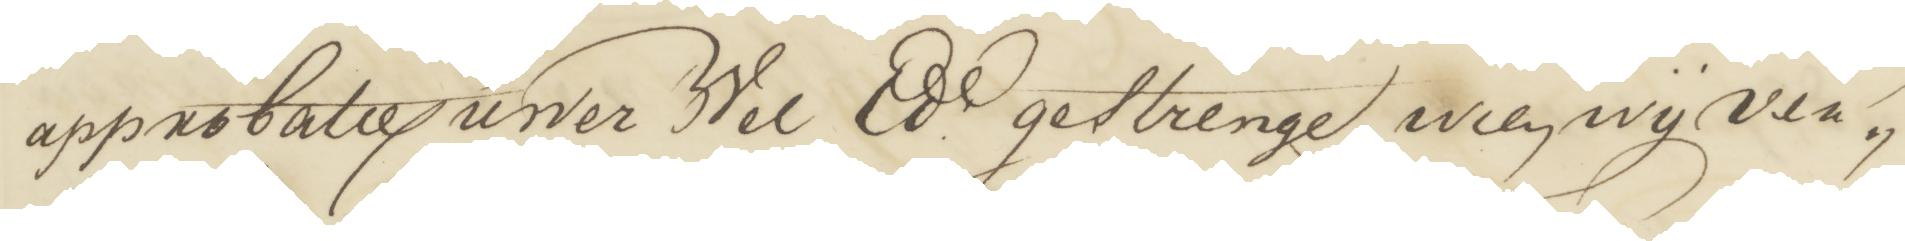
approbatie uwer Wel Ed:e gestrenge, wien wij ver„
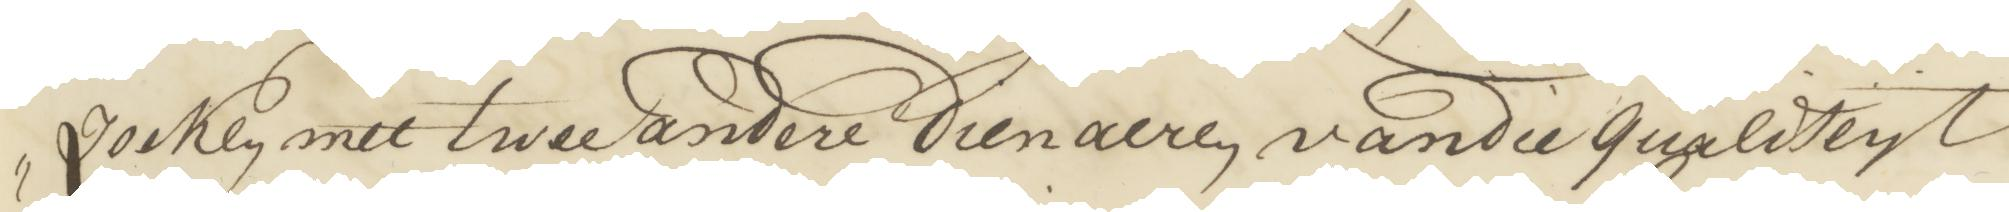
„zoeken met twee andere dienaeren vandie qualiteijt
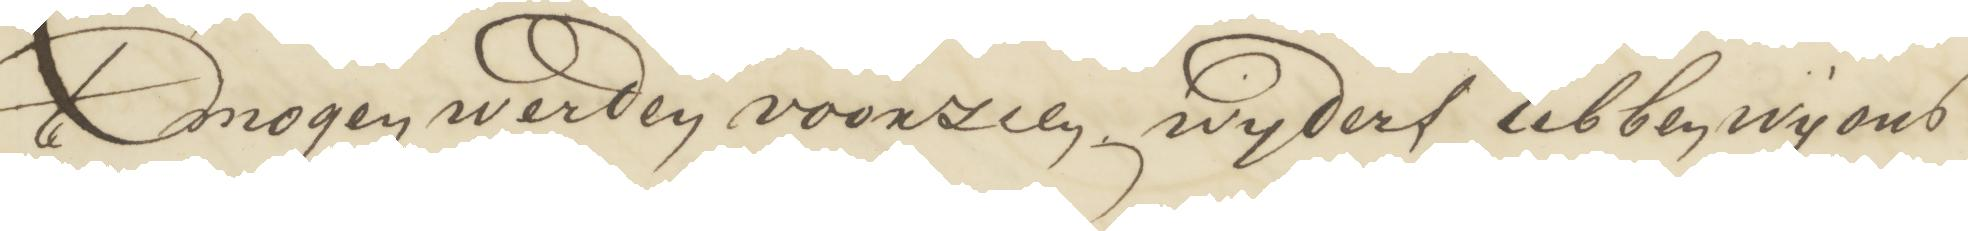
te mogen werden voorzien. wijders hebben wij ons
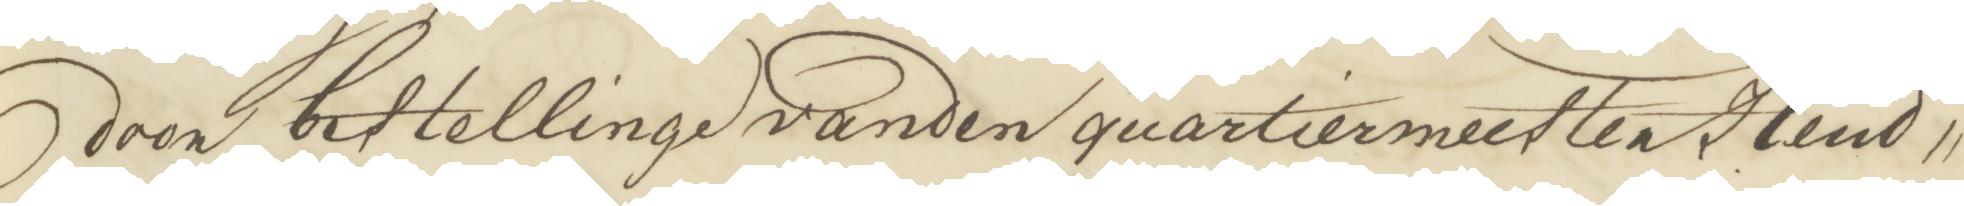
door bestellinge vanden quartiermeester Hend„k
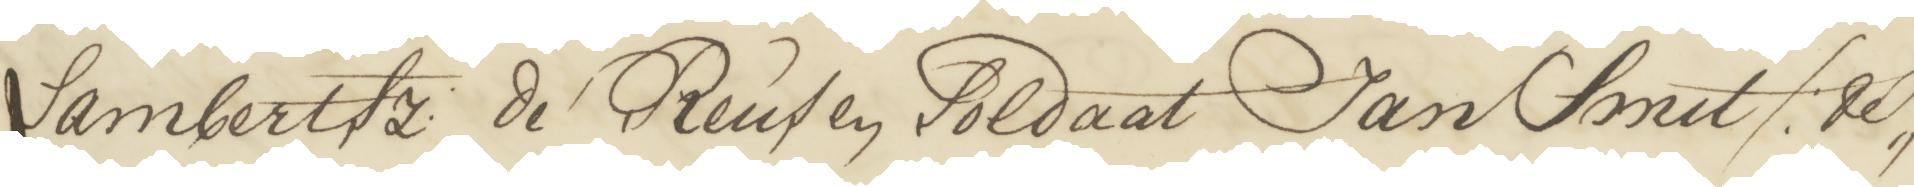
Lambertsz: de Reus en soldaat Jan Smit /: de
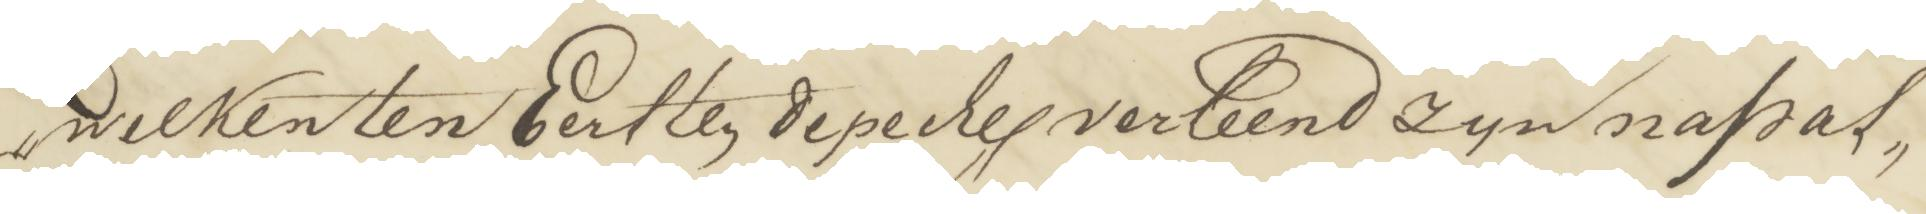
„welken ten Eersten depeche verleend zijn napas„
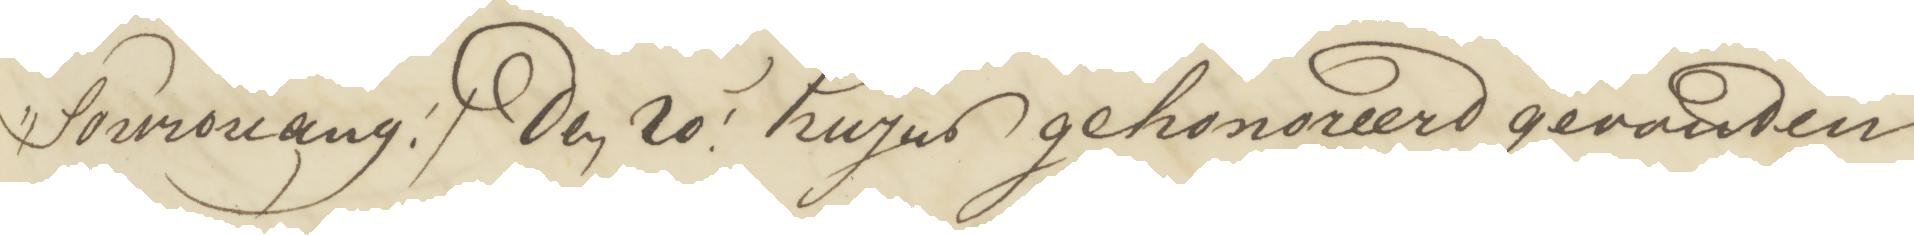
„sourouang:/ den 20:' hujus gehonoreerd gevonden
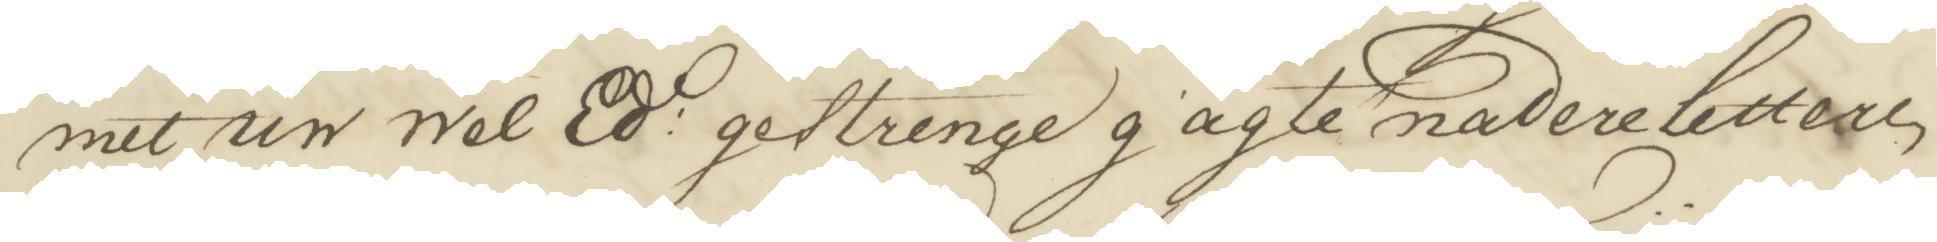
met uw wel Ed:s gestrenge g’agte nadere letteren
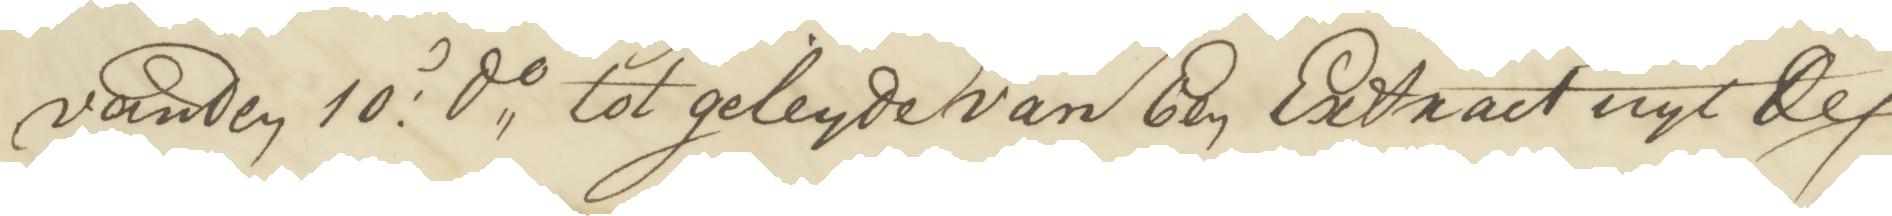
vanden 10:' d„o tot geleijde van Een Extract uijt De
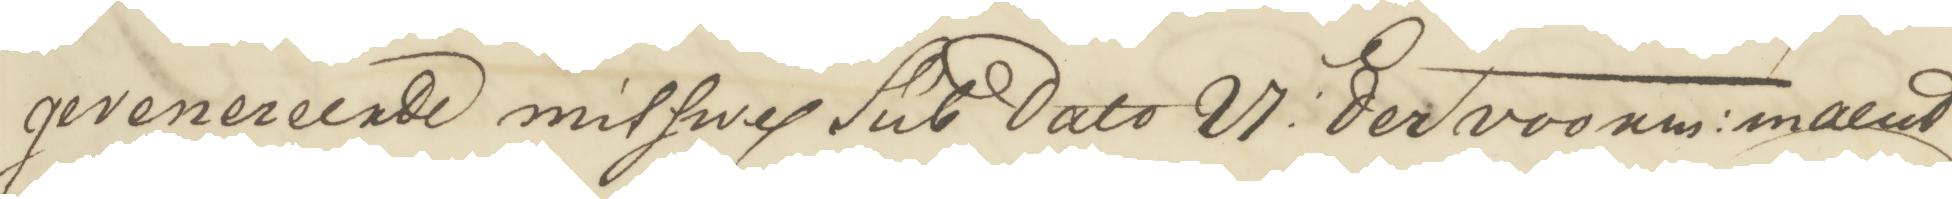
gevenereerde missive sub dato 27:e der voorm: maend
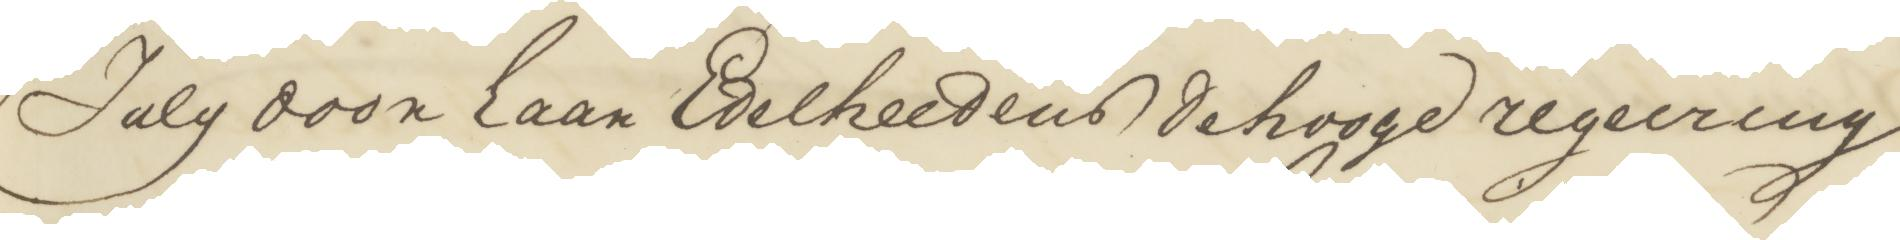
Julij door haar Edelheedens dehooge regeering
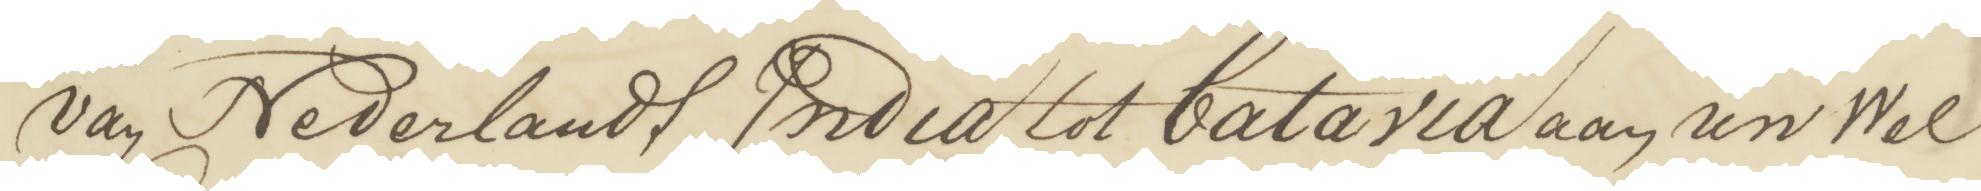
van Nederlands Jndia tot batavia aan uw Wel
